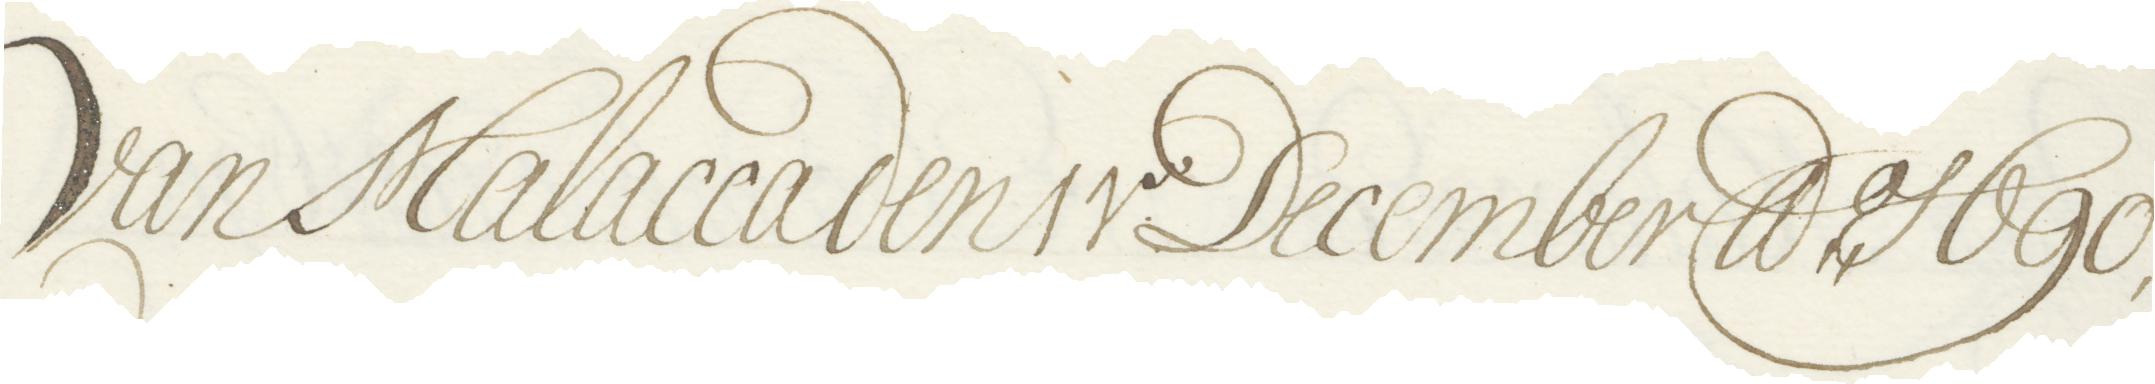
Van Malacca den 11e December A„o 1690,
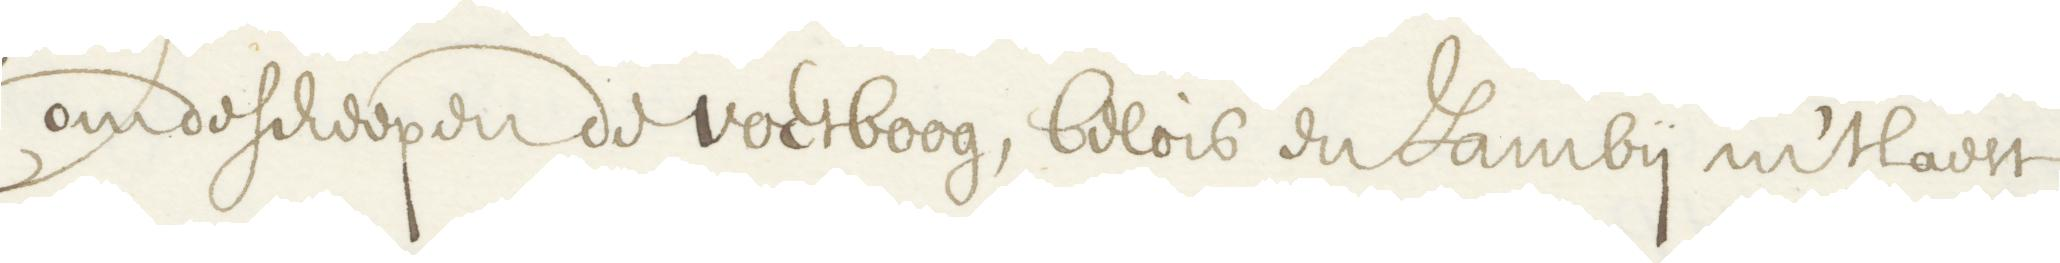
om de scheepen de voetboog, belois en Iambij in ’t laest
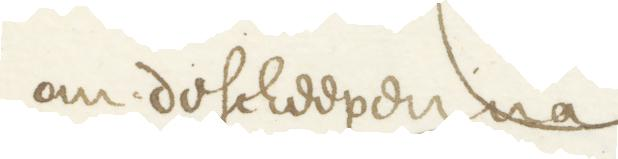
om de scheepen na
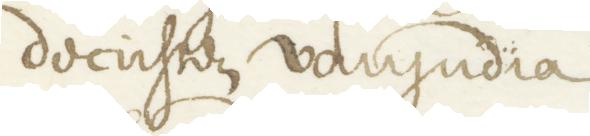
de custen van jndia
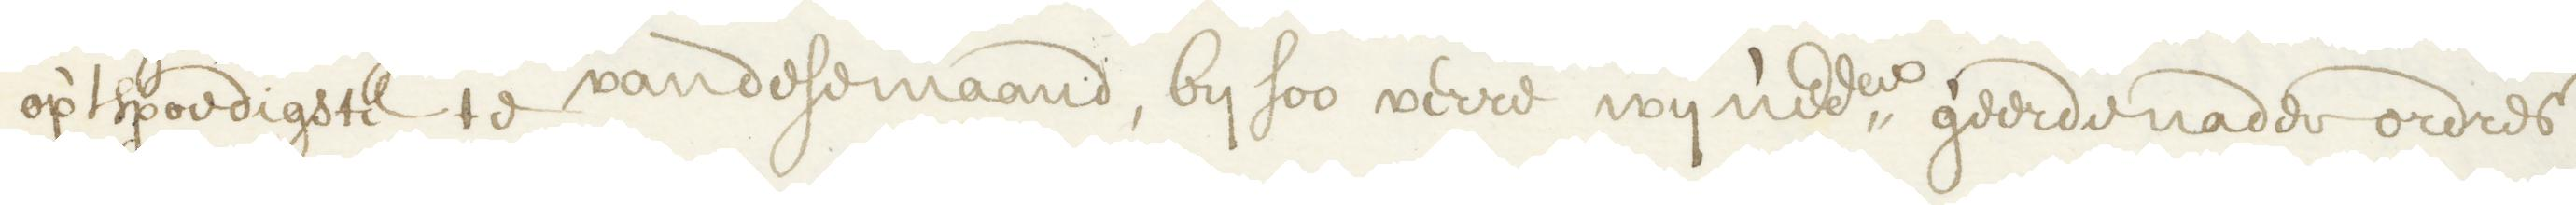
op 'tspoedigste te van dese maand, by soo verre wy uEd„le geerde nader ordres
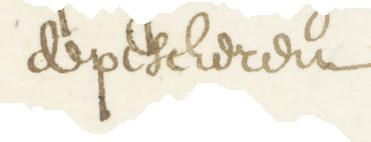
depescheren
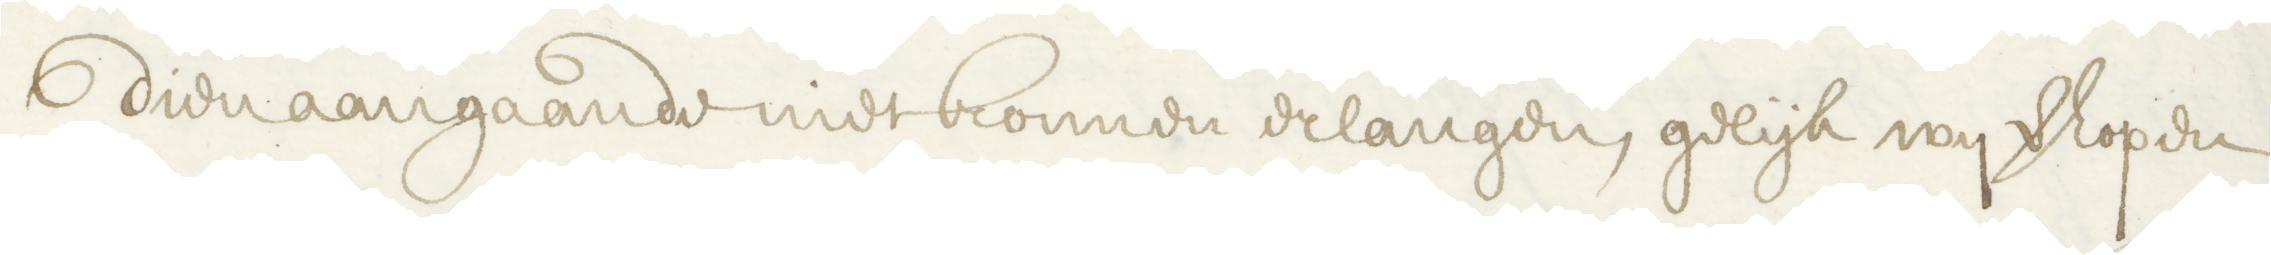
dien aangaande niet konnen erlangen, gelijk wy verhopen
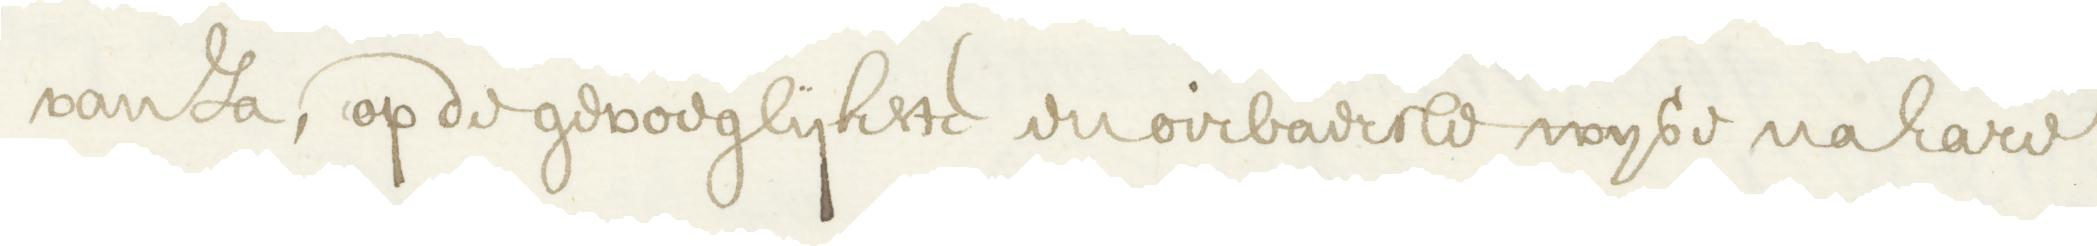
van Ia, op de gevoeglijkste en oirbaerste wyse na hare
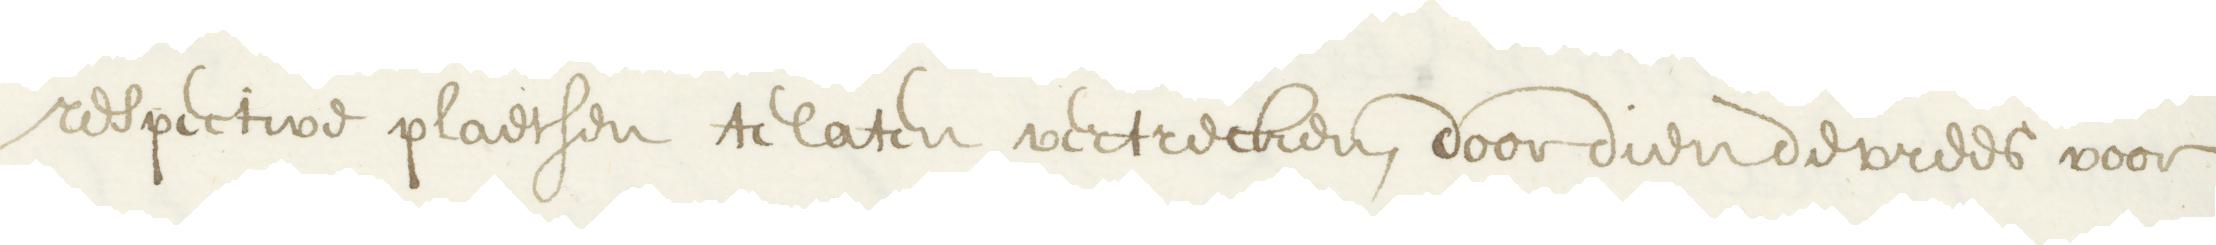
respective plaetsen te laten vertrecken, door dien de vrees voor
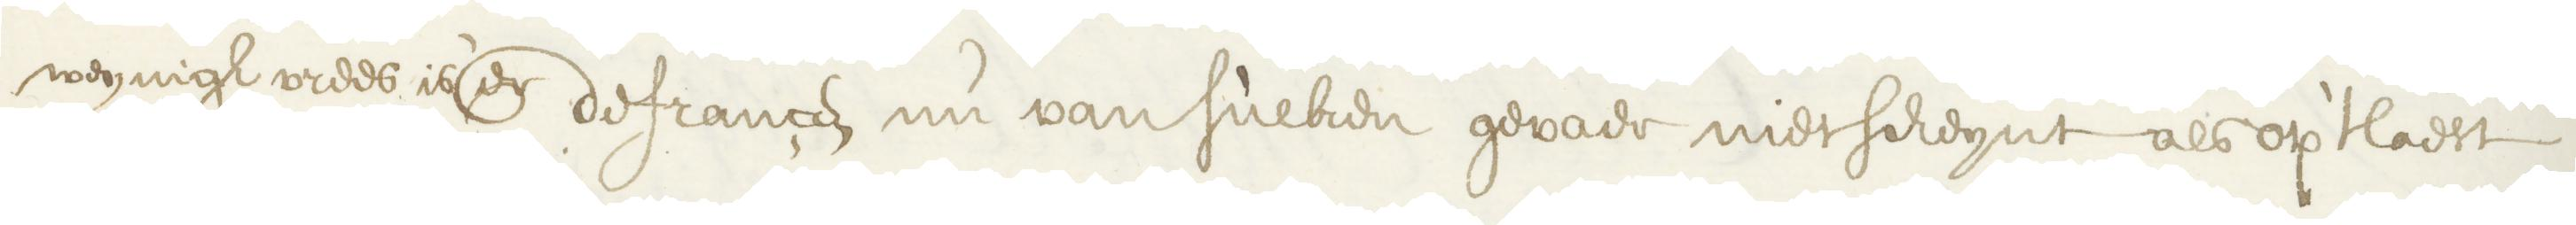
weynigh vrees is er de francen nu van sulken gevaer niet scheynt als op 'tlaest
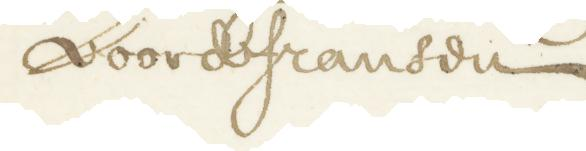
voor de fransen
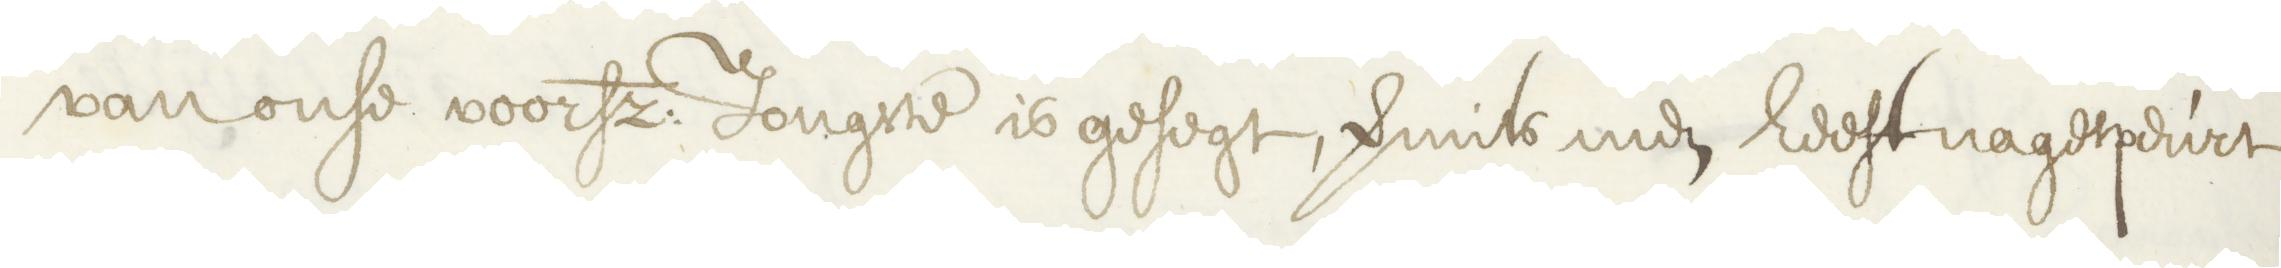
van onse voorsz: Iongste is gesegt, vermits men heeft nagespeurt
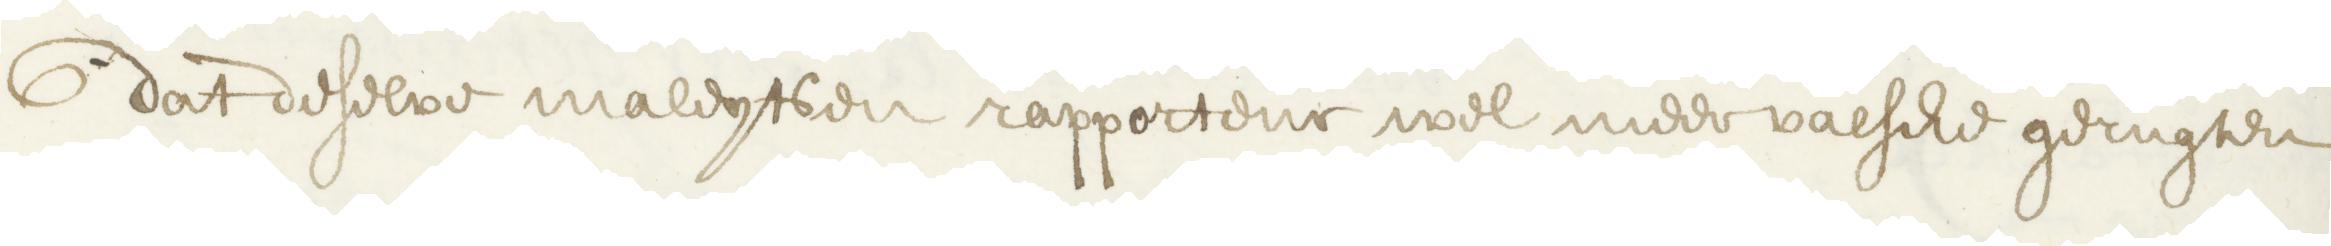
dat deselve maleytsen rapporteur wel meer valsche gerugten
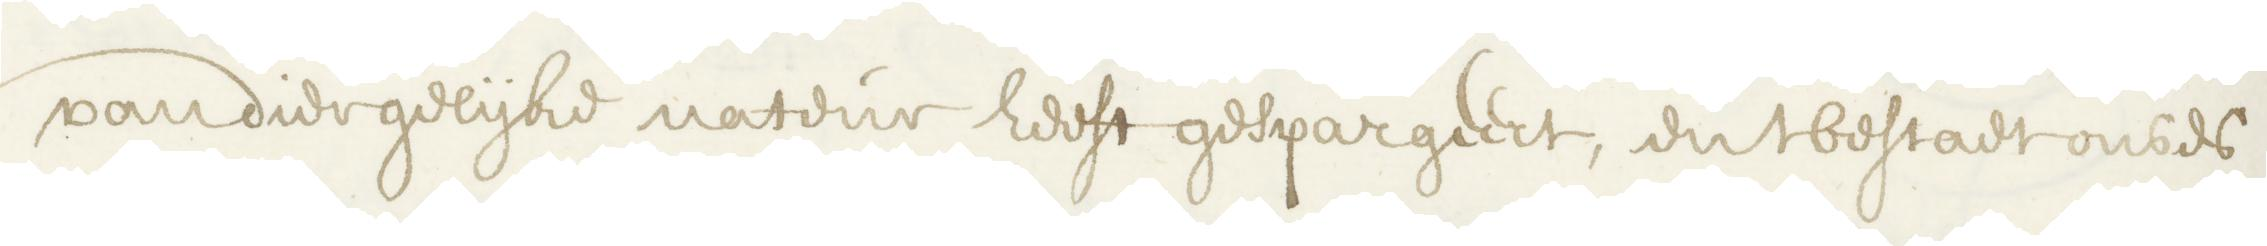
van dier gelijke nateur heeft gespargeert, en 't bestaet onses
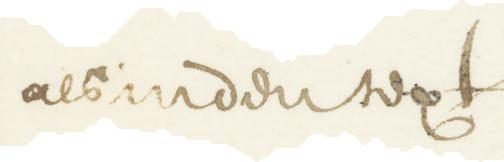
als inden text
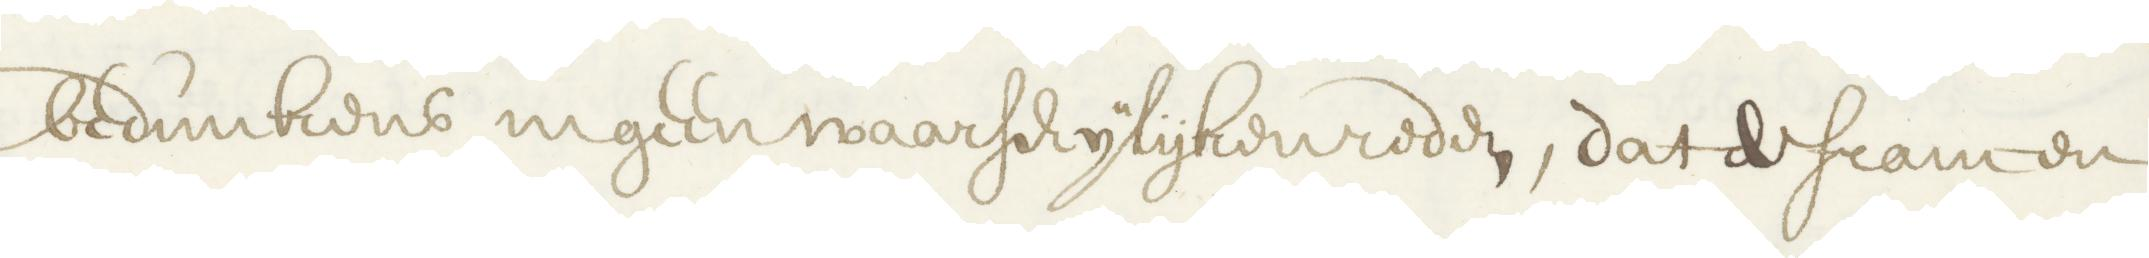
bedunkens in geen waarschijlijken reden, dat de francen
